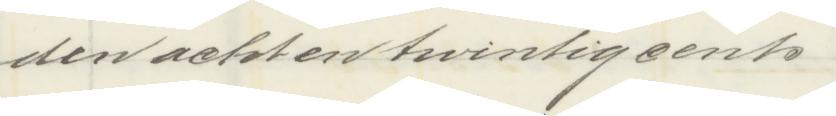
den acht en twintig cents
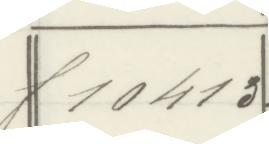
ƒ 10413
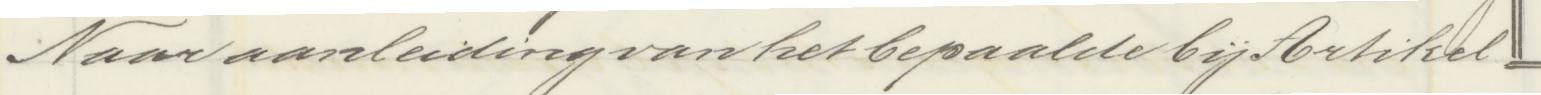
Naar aanleiding van het bepaalde bij Artikel
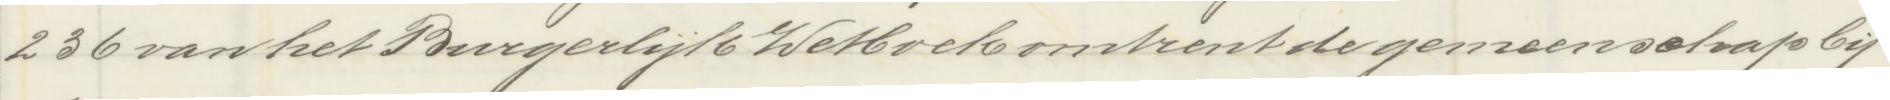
236 van het Burgerlijk Wetboek omtrent de gemeenschap bij
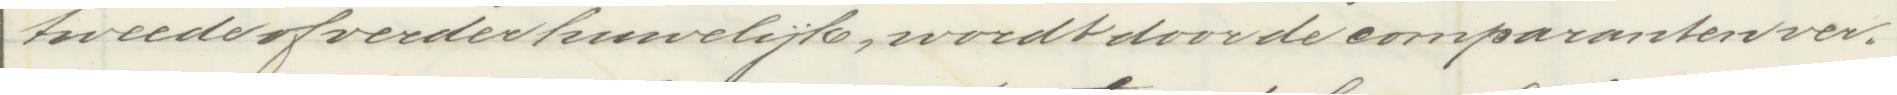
tweede of verder huwelijk, wordt door de comparanten ver„
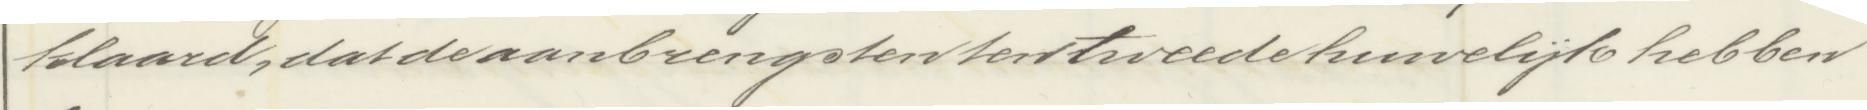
klaard, dat de aanbrengsten ten tweede huwelijk hebben
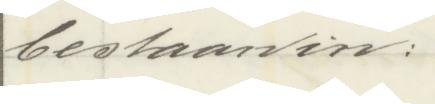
bestaan in:
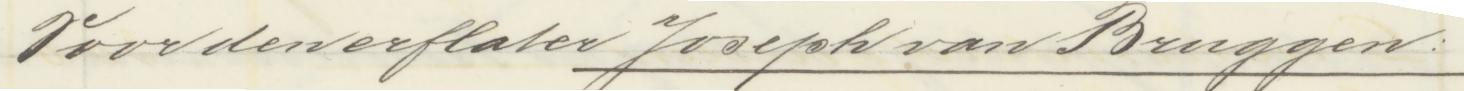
Voor den erflater Joseph van Bruggen.
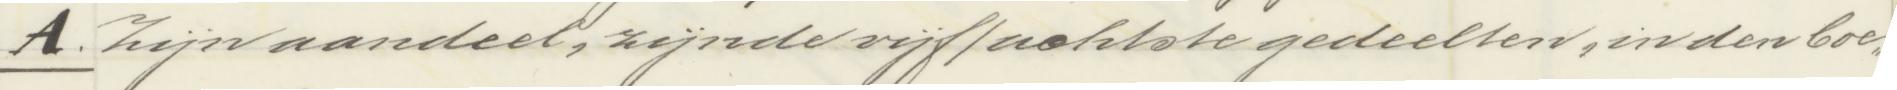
A. Zijn aandeel, zijnde vijf/achtste gedeelten, in den boe„
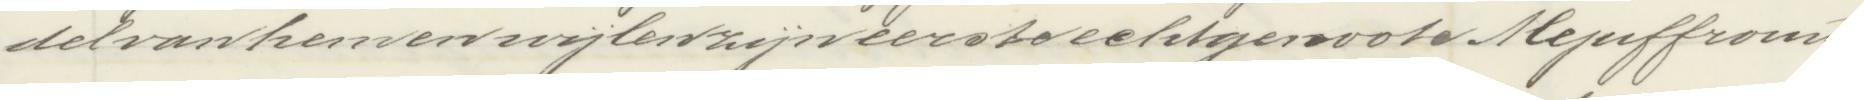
del van hem en wijlen zijn eerste echtgenoote Mejuffrouw
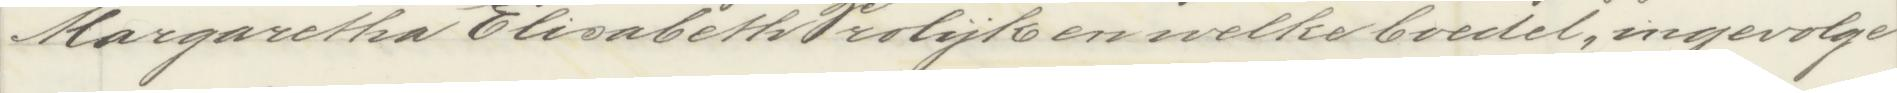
Margaretha Elisabeth Vrolijk en welke boedel, ingevolge
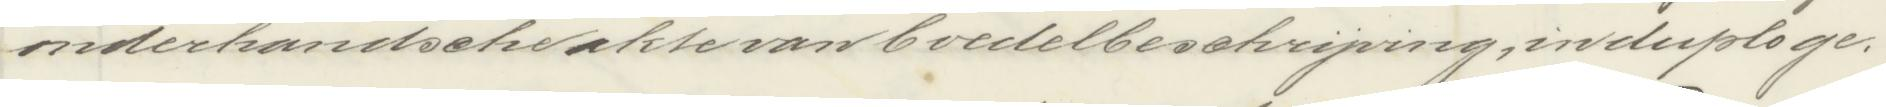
onderhandsche akte van boedelbeschrijving, in duplo ge„
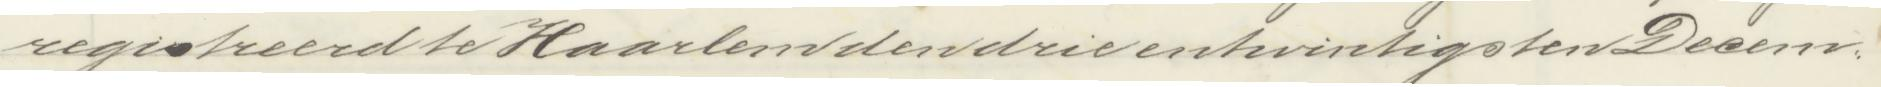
registreerd te Haarlem den drie en twintigsten Decem„
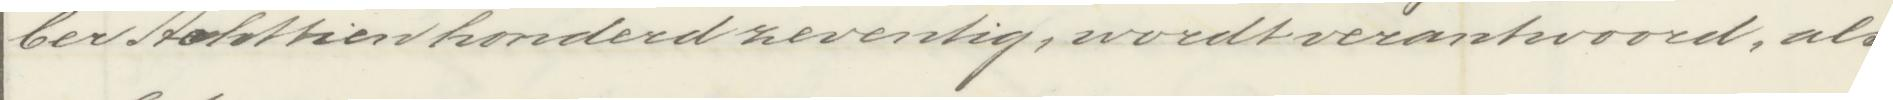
ber Achttien honderd zeventig, wordt verantwoord, als
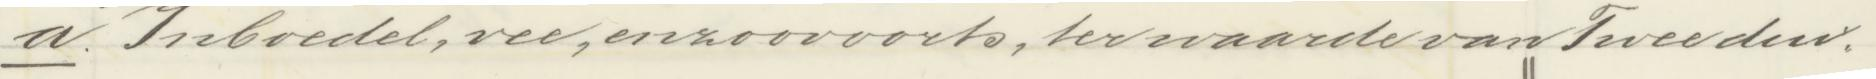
a. Inboedel, vee, en zoovoorts, ter waarde van Twee dui„
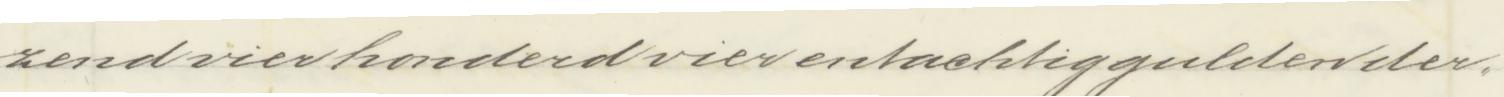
zend vier honderd vier entachtig gulden der„
